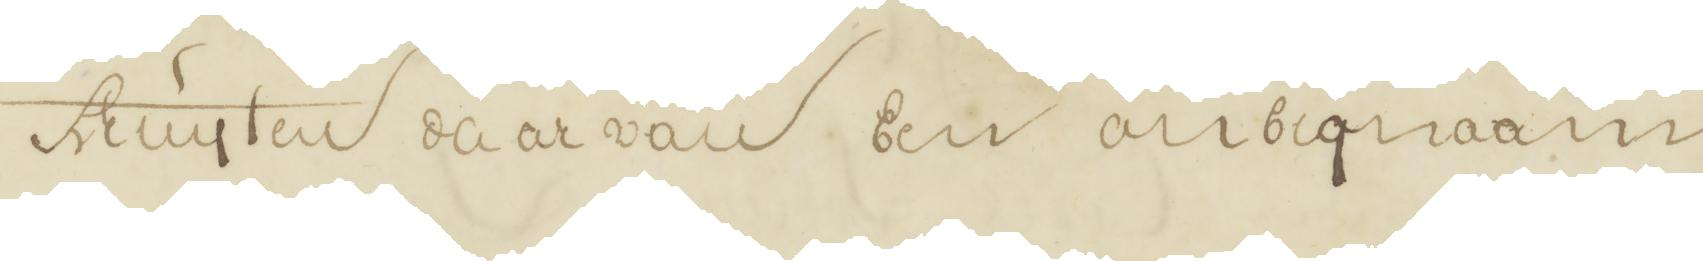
d.o „ „ schuyten daar van Een onbequaam.
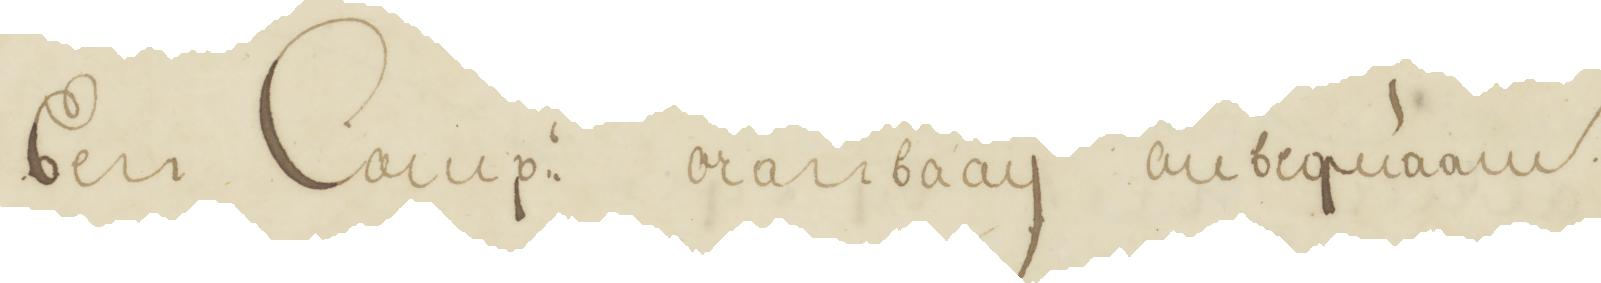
Een Comp:e oranbaay onbequaam.
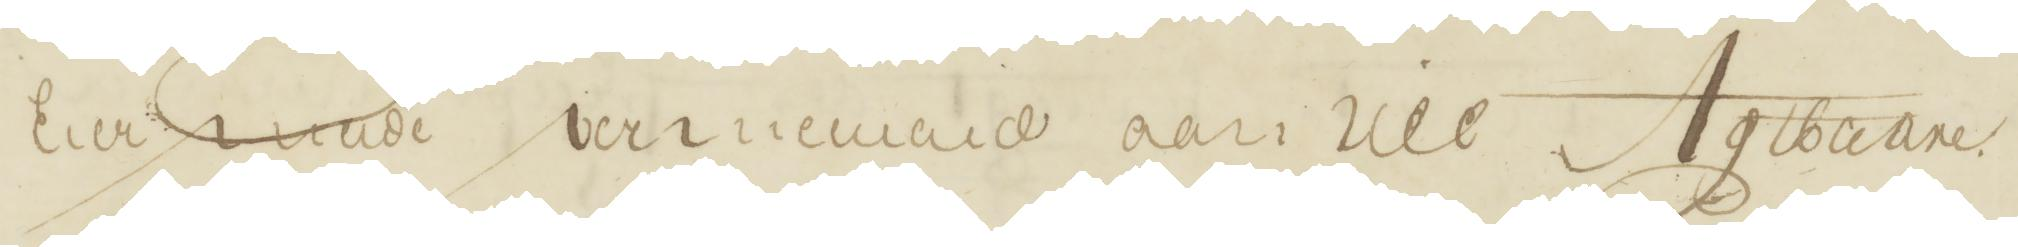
hier meede verniewende aan UEE Agtbaare.
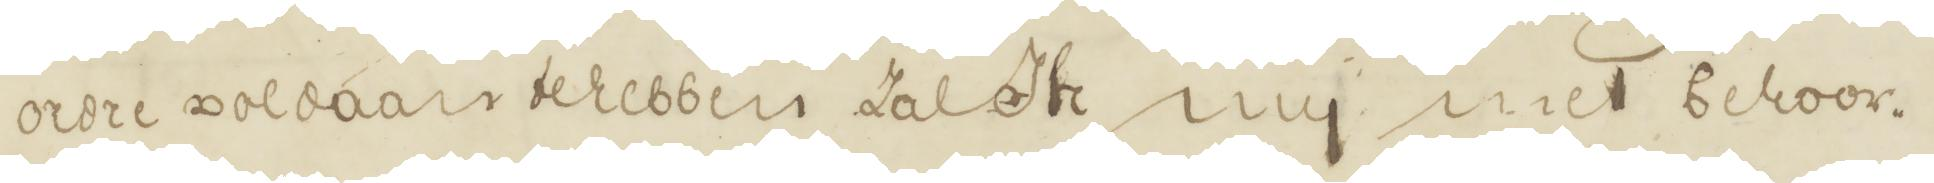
ordre voldaan te hebben zal Ik mij met behoor„
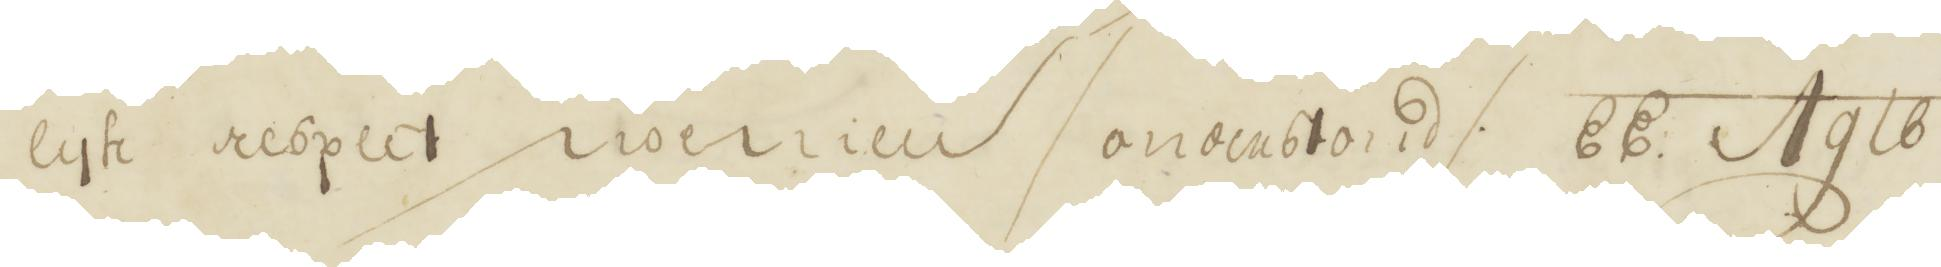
lyk respect noemen / onderstond / E E: Agtb
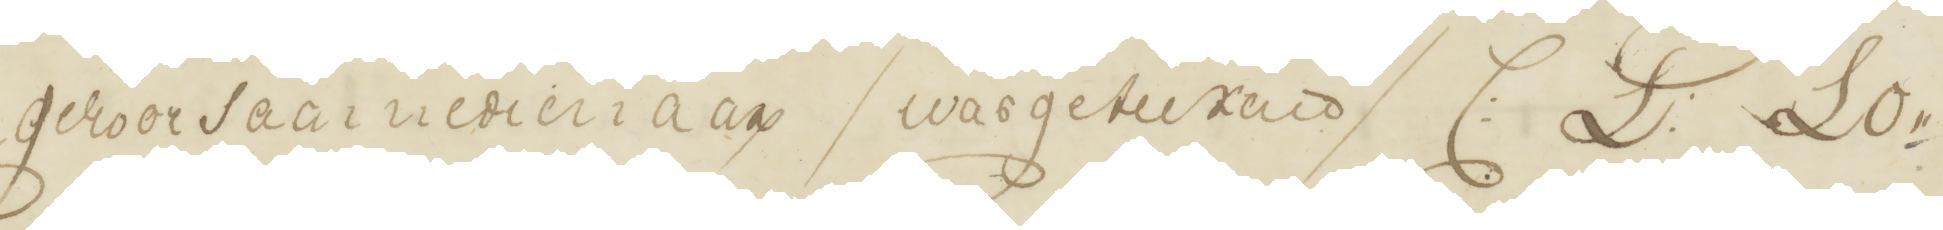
gehoorsaame dienaar / was geteekend / C: L: Lo„
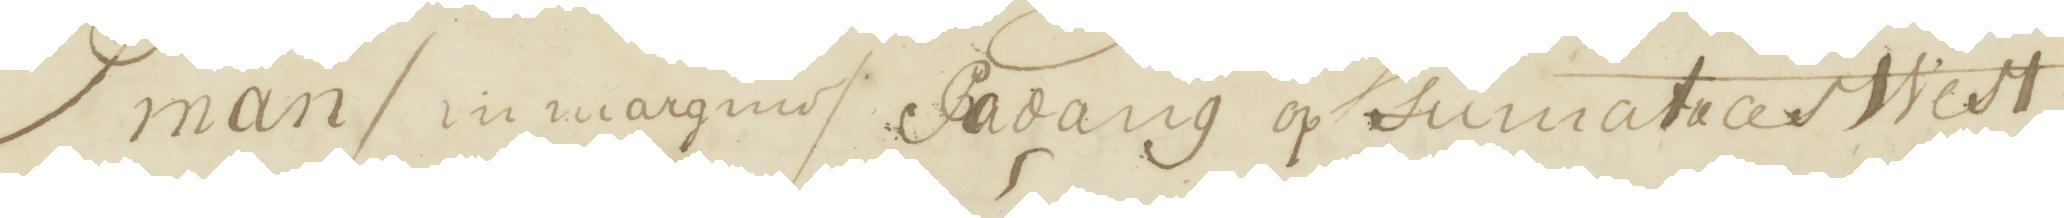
man / in margine / Padang op sumatras West
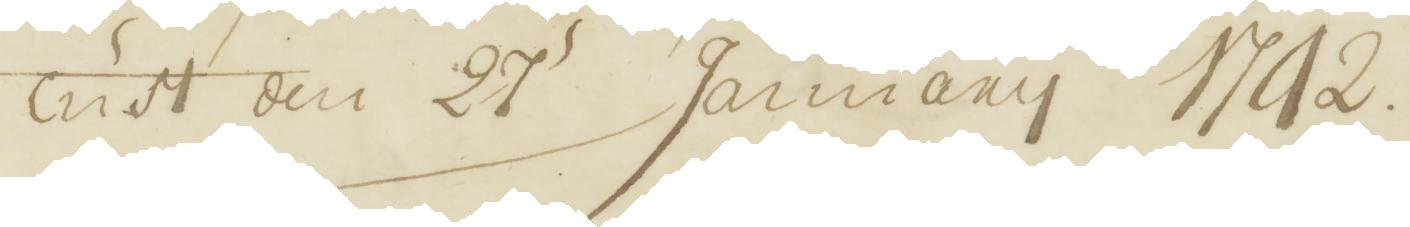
cust den 27' January 1742.
